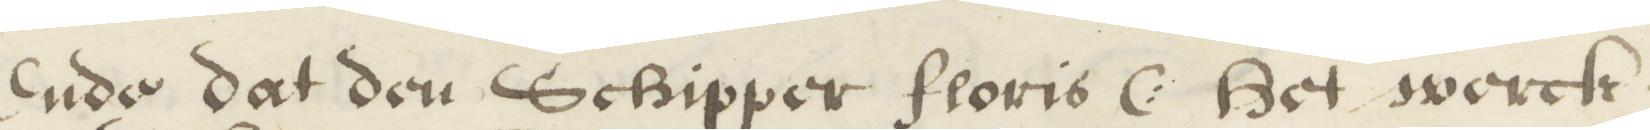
Ende dat den schipper floris (: het werck
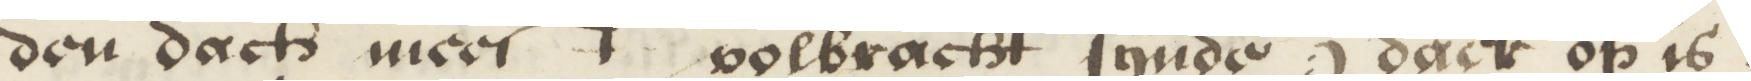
den dach meest volbracht sijnde :) daer op is
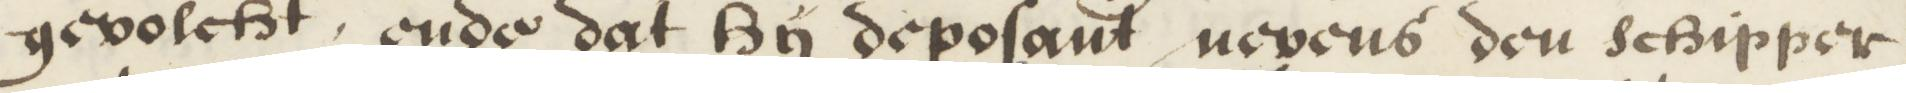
gevolcht, ende dat hij deposant nevens den schipper
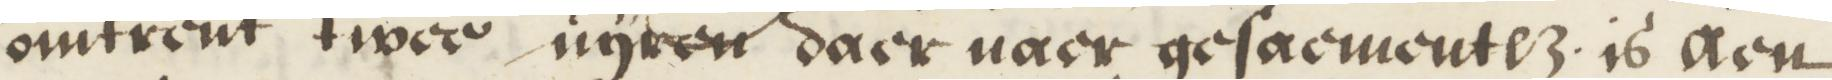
omtrent twee uijren daer naer gesaementlijk is aen
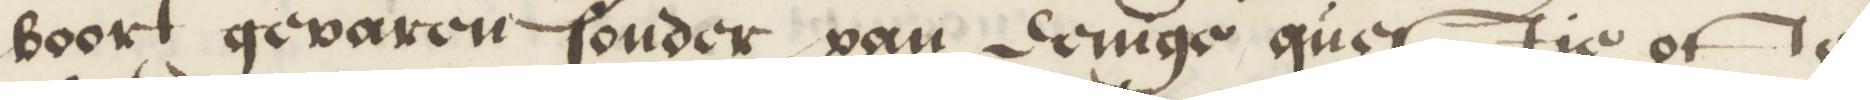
boort gevaren sonder van eenige questie of te
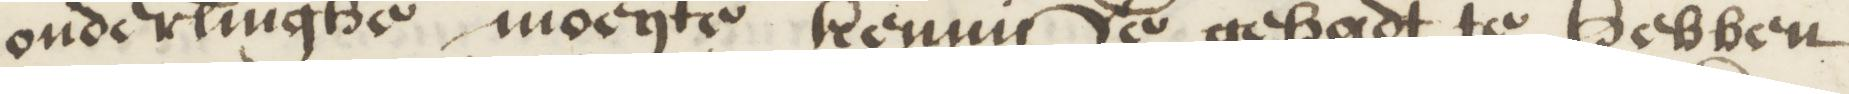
onderlinghe moeijte kennisse gehadt te hebben
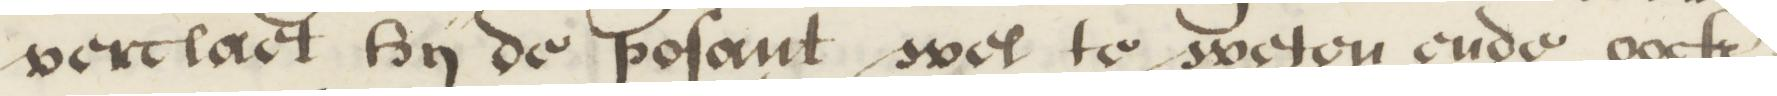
verclaet hij de posant wel te weten ende oock
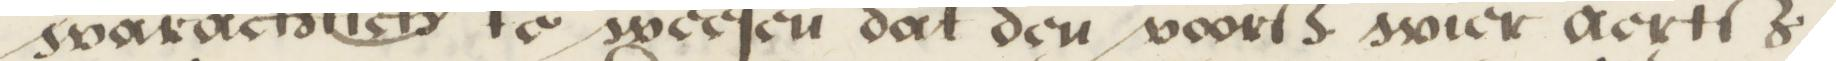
warachtich te weesen dat den voorsz. vier aertsz.
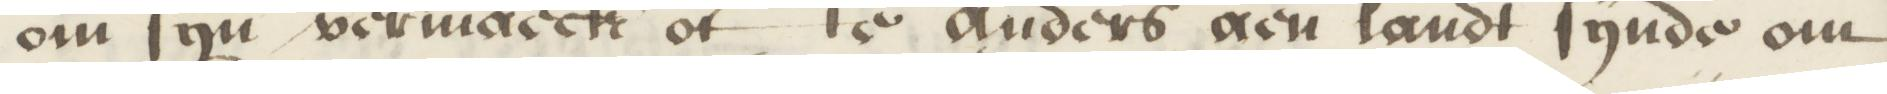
om sijn vermaeck of te anders aen landt sijnde om
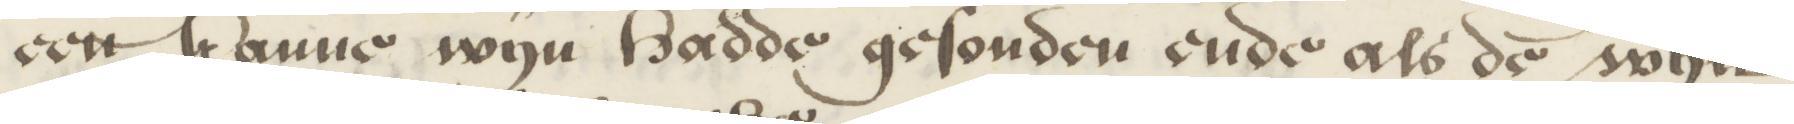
een kanne wijn hadde gesonden ende als de wijn
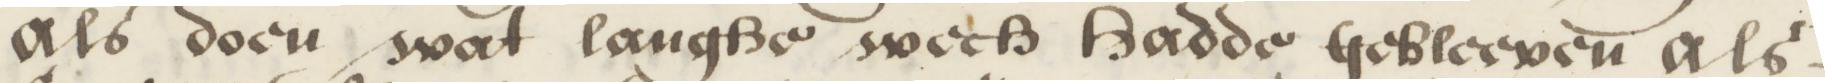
als doen wat langhe wech hadde gebleeven als
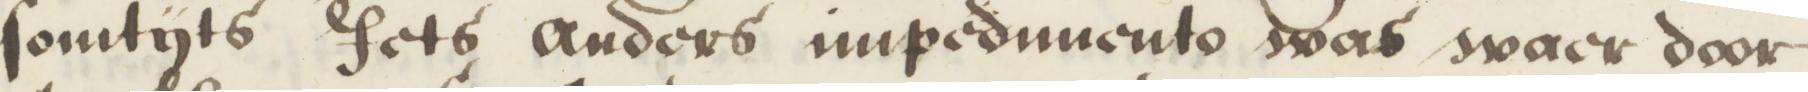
somtijts Jets anders inpedimento was waer door
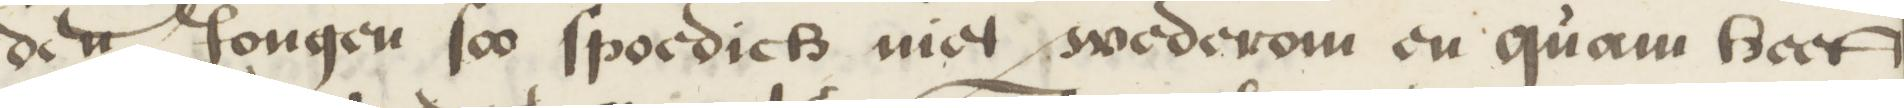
den Iongen so spoedich niet wederom en quam heeft
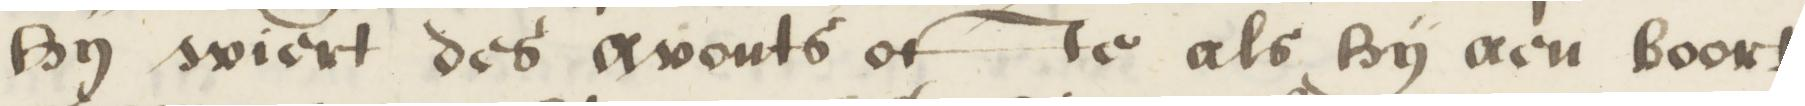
hij wiert des avonts ofte als hij aen boort
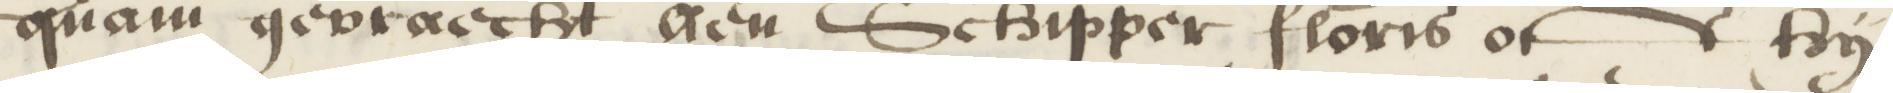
quam gevraecht den schipper floris off hij
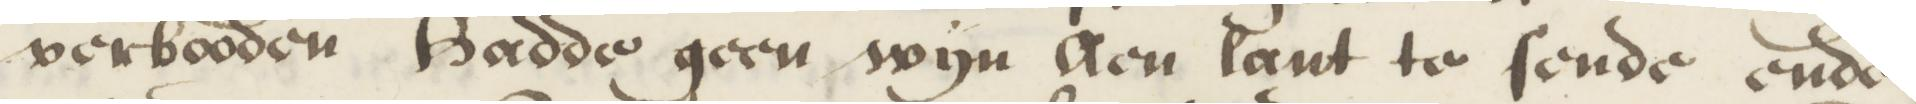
verbooden hadde geen wijn aen lant te sende ende
